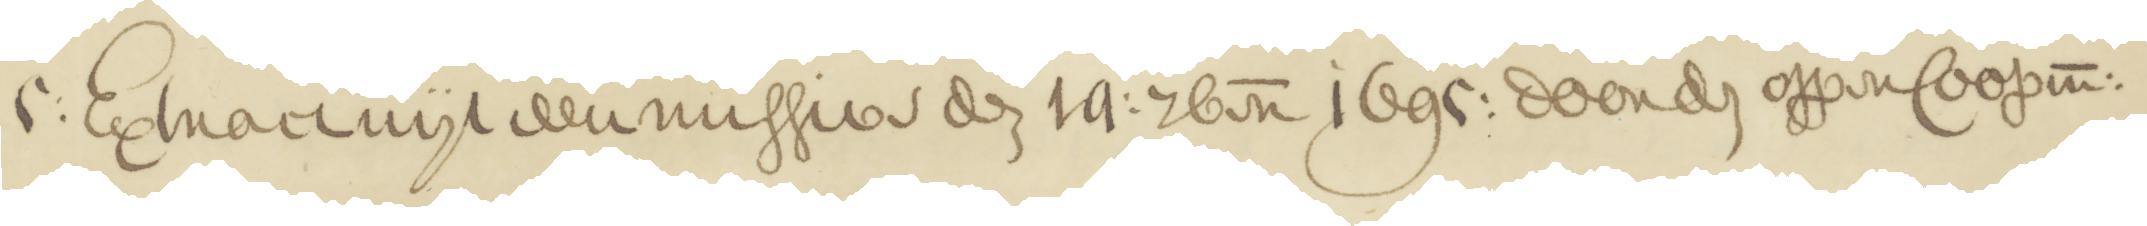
5: Extract uijt een missive den 14: 7ber 1695: door den oppercoopm:
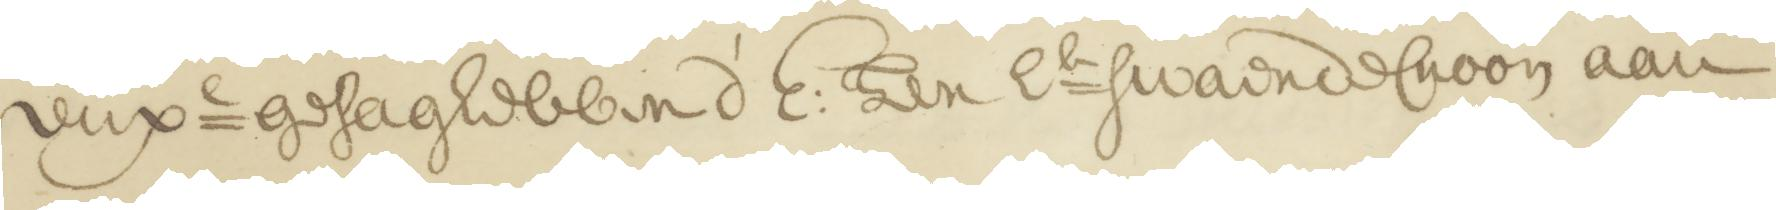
en p=l gesaghebber d’ E: her h=k swaerdecroon aan
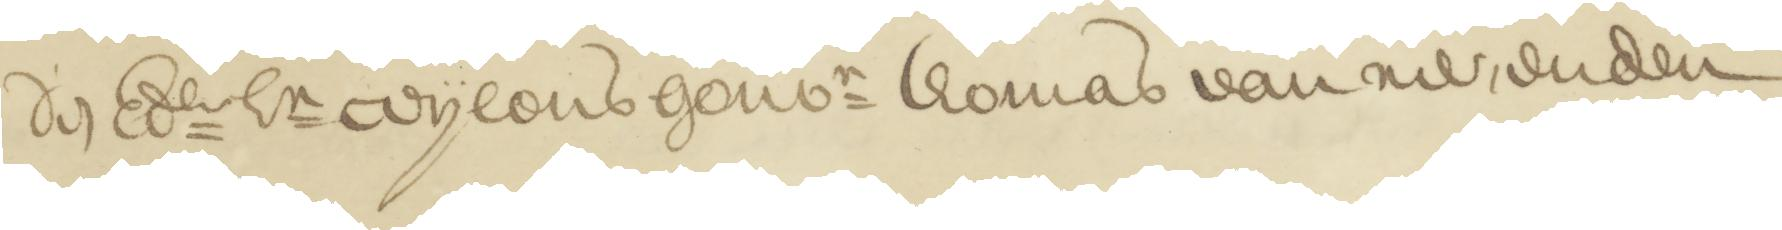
den Ed=e h=r ceijlons gouv=r thomas van re, enden
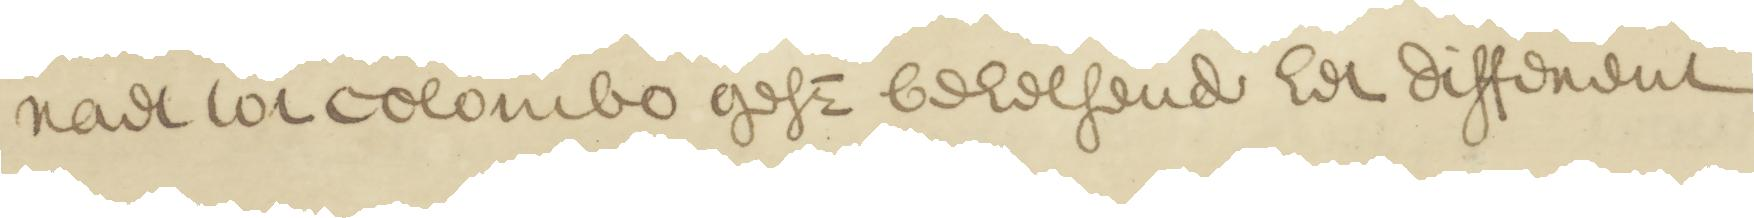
raet tot colombo gesz behelsende het different
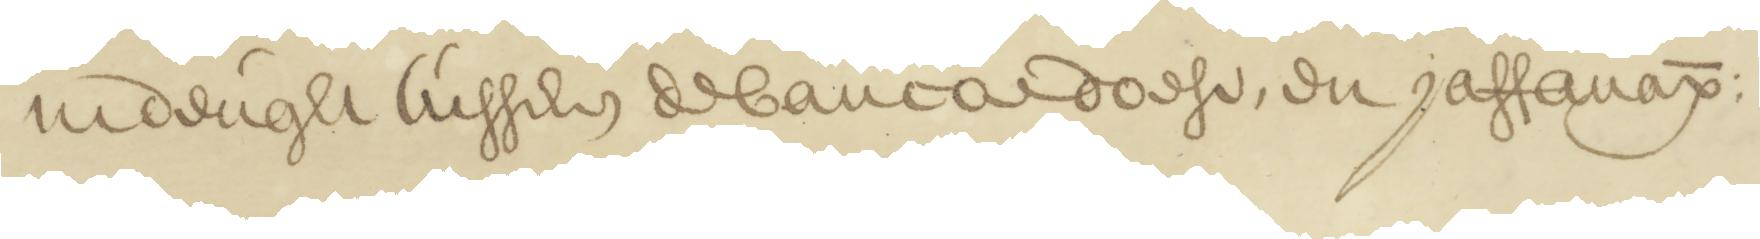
indeught tusschen debancoe doese, en jaffanap:
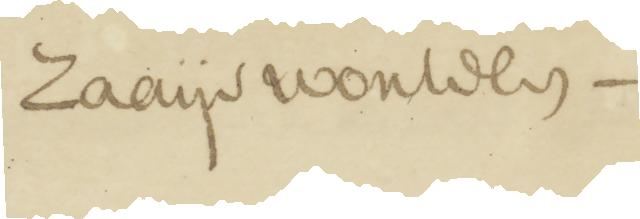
Zaaije wortelen-
